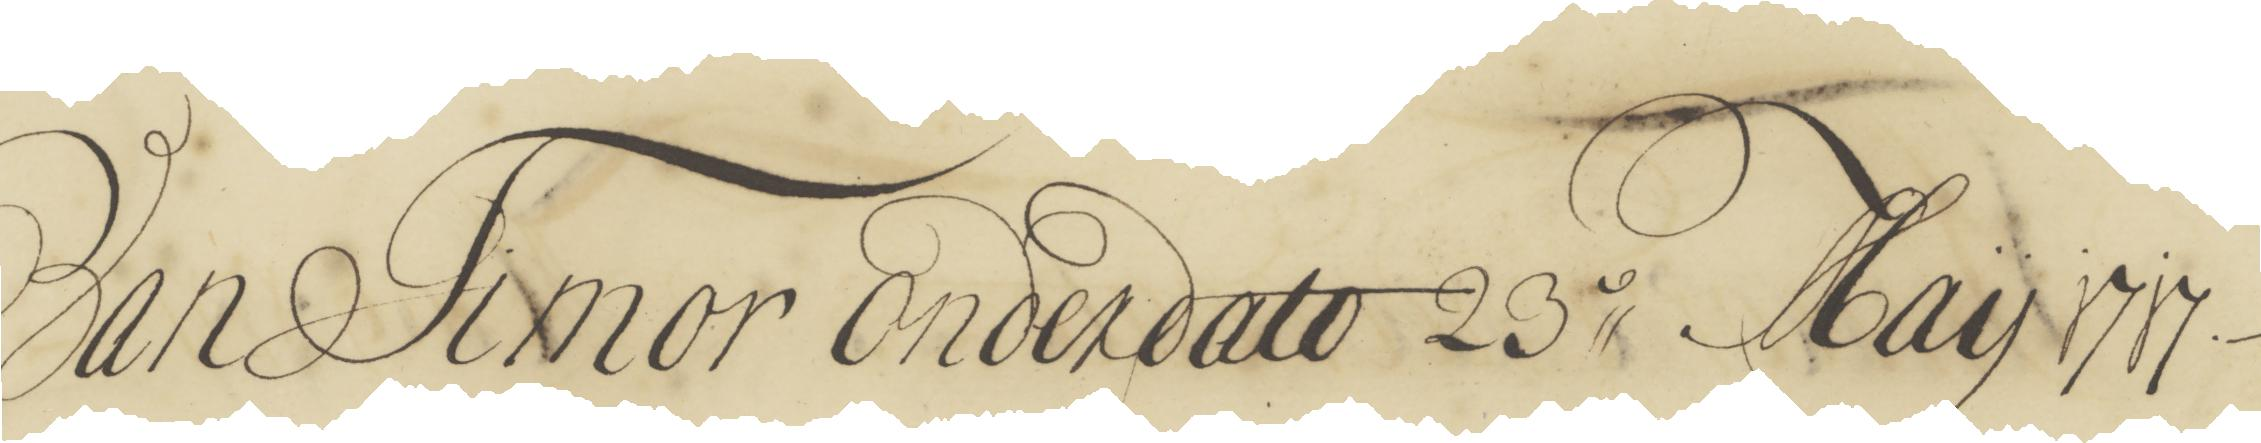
Van Timor onderdato 23„e Maij 1717.
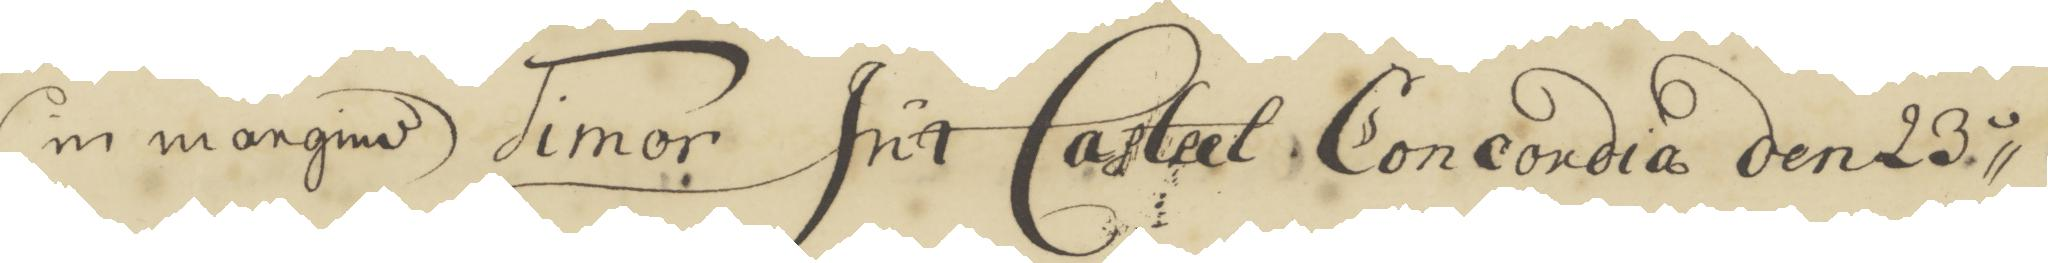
in margine) Timor Jn't Casteel Concordia den 23„e
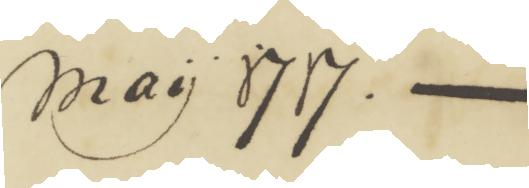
maij 1717. —
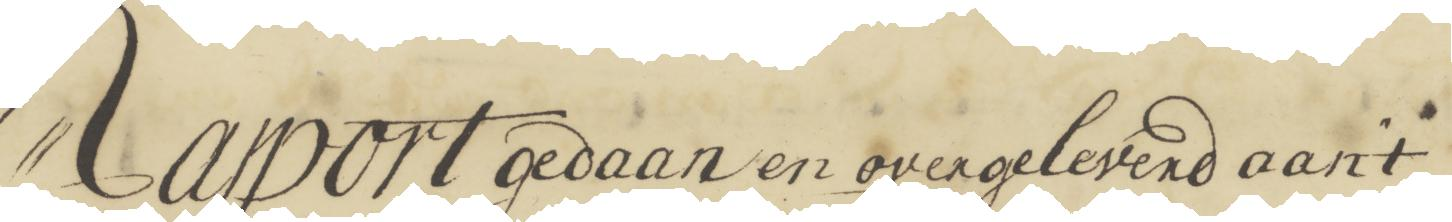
Rapport gedaan en overgeleverd aan't
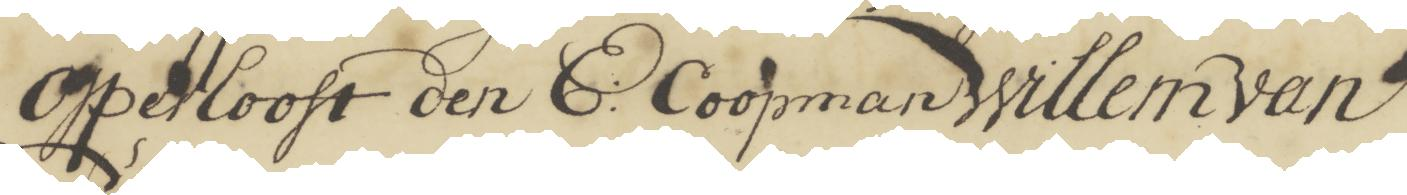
opperhooft den E: Coopman Willem van
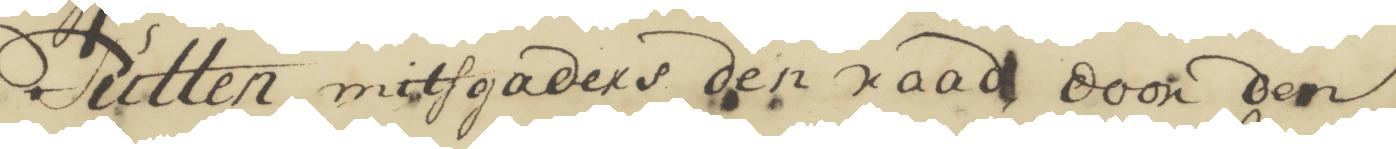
Putten, mitsgaders den raad door den
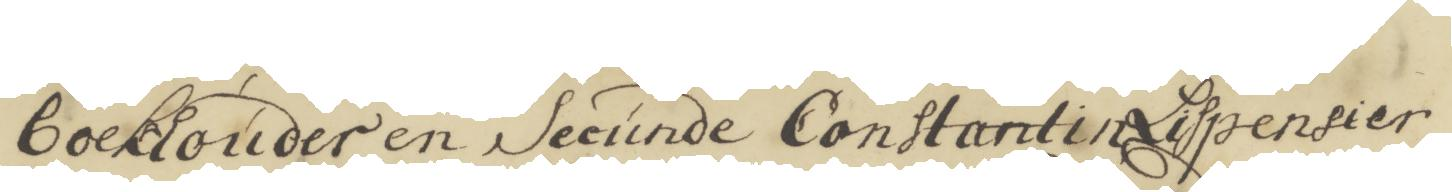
boekhouder en Secunde Constantin Lispensier
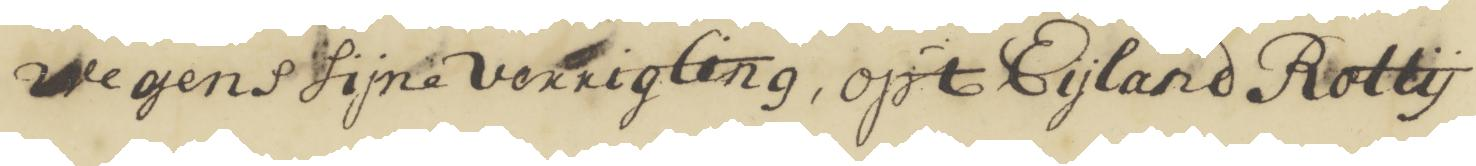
wegens sijne verrigting, op ’t Eijland Rottij
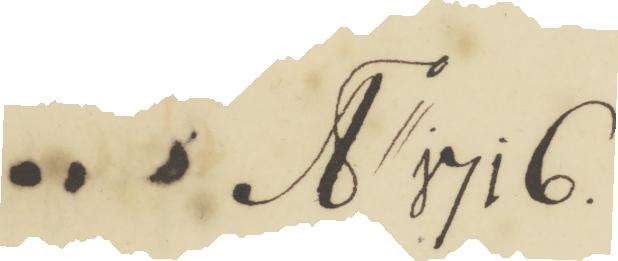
A„o 1716.
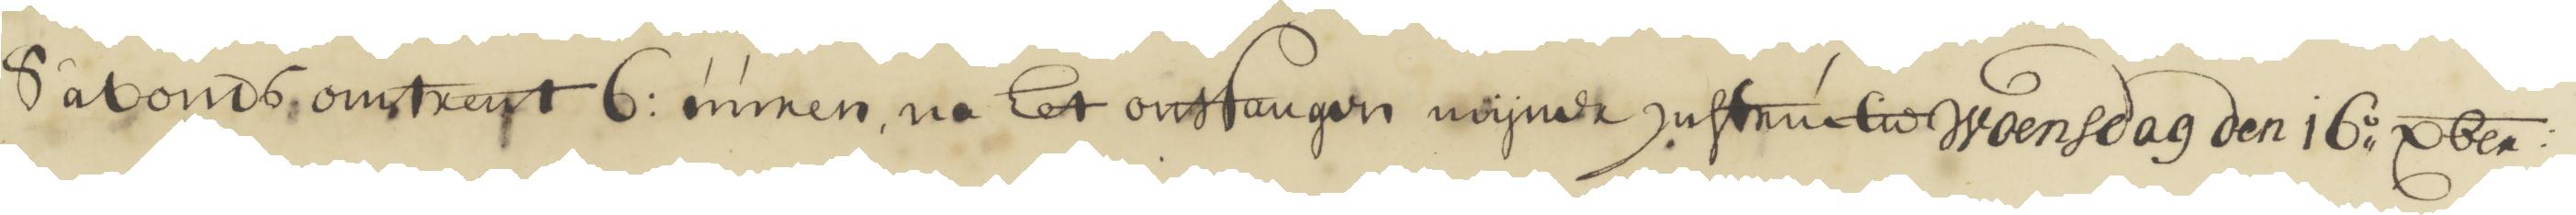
S'avonds omtrent 6: uuren, na het ontfangen mijner jnstructie woensdag den 16„e xber:
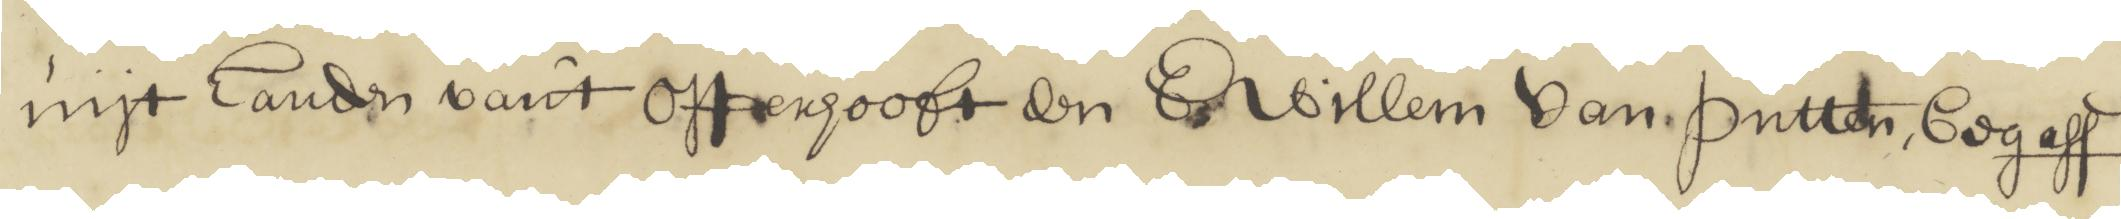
uijt handen van't opperhooft den E Willem van Putten, begaff
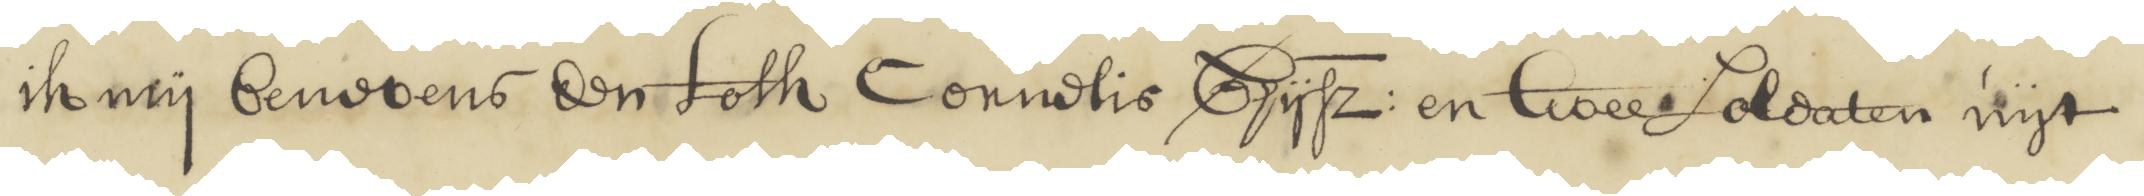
ik mij benevens den tolk Cornelis Ghijsz: en twee soldaten uijt
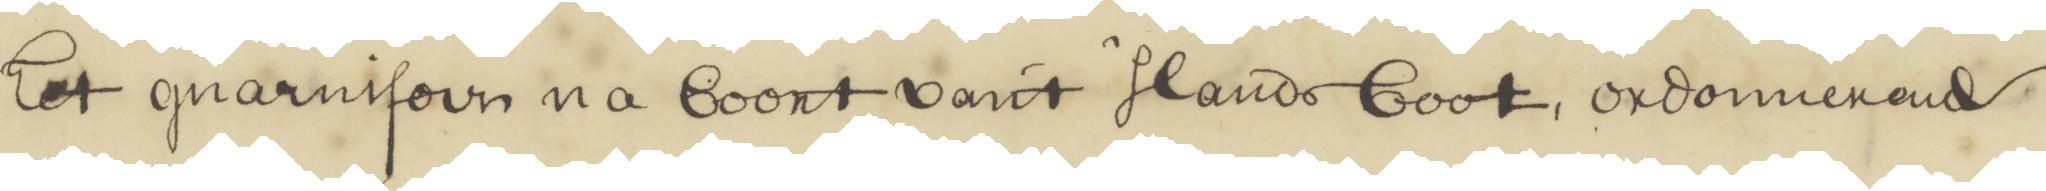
het guarnisoen na boort van't 'slands boot, ordonnerende
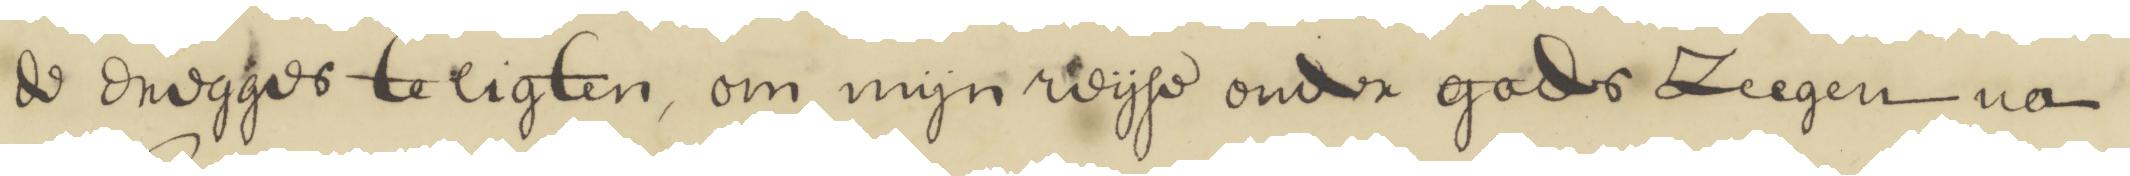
de dregges te ligten, om mijn reijse onder gods zeegen na
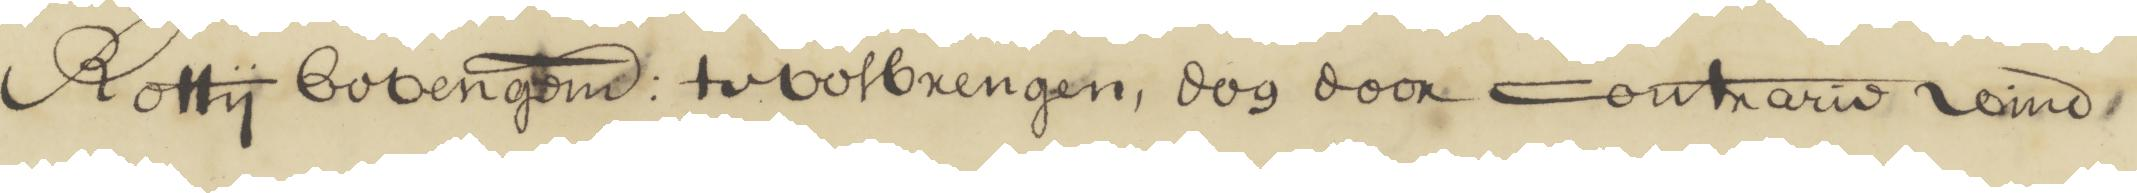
Rottij bovengem: te volbrengen, dog door contrarie wind
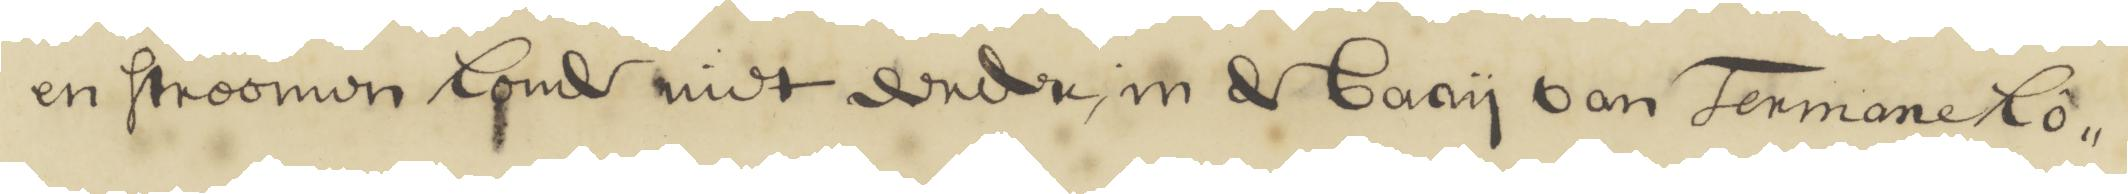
en stroomen konde niet eerder, in de baaij van Termane ko„
